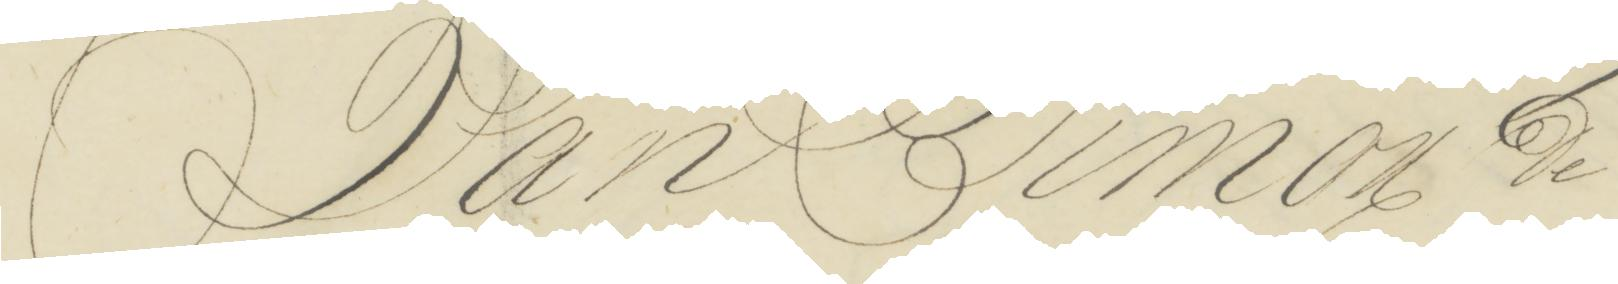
Van Timor de
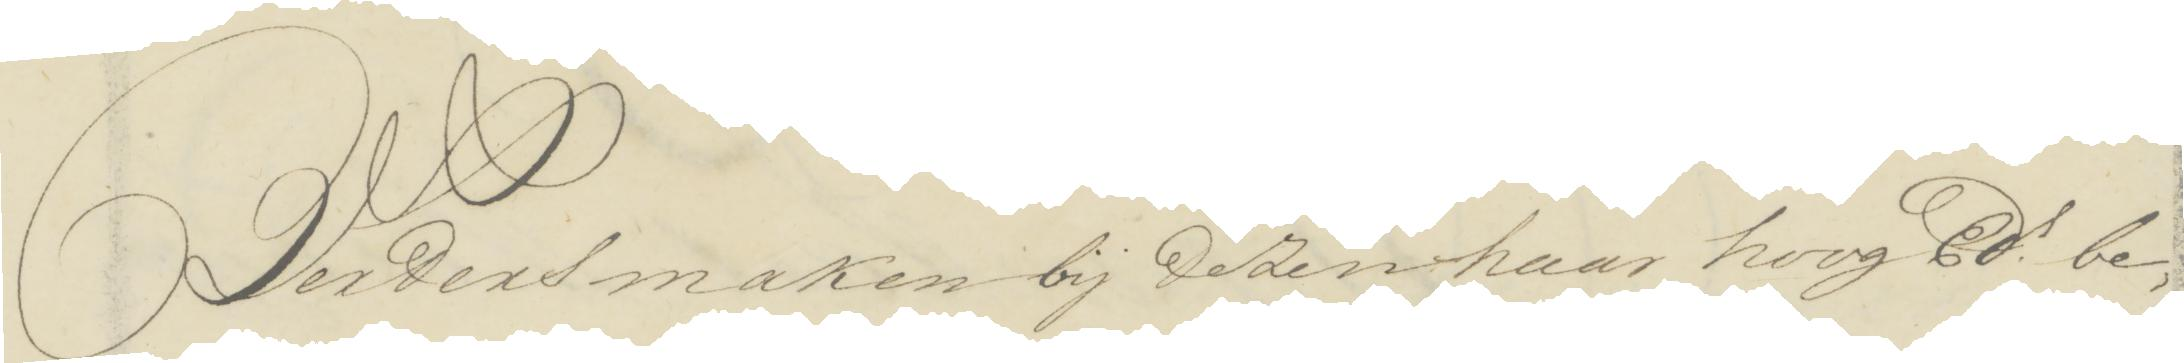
Verders maken bij dezen haar hoog Ed:s be„
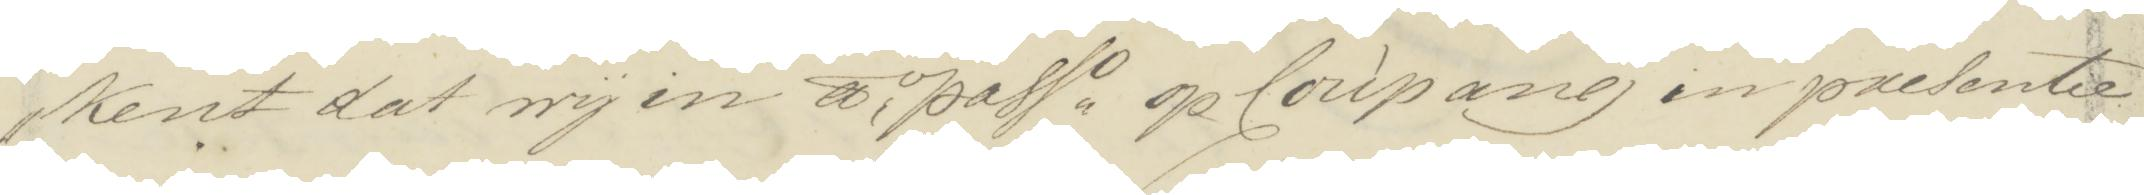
„kent dat wij in a„o pass„o op Coupang in presentie
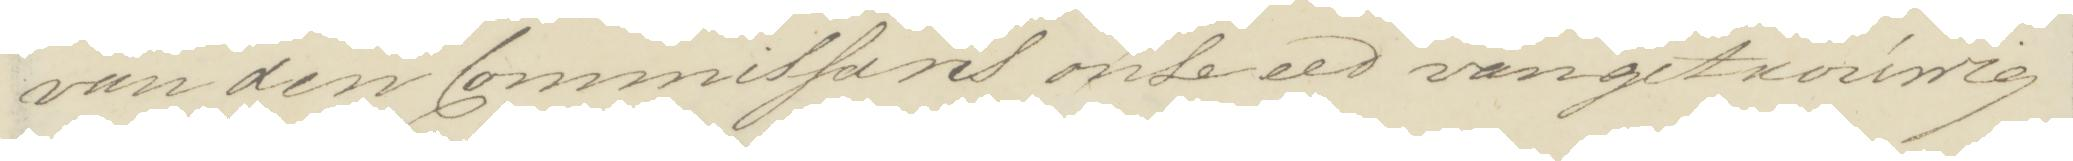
van den Commissaris onse eed van getrouwien
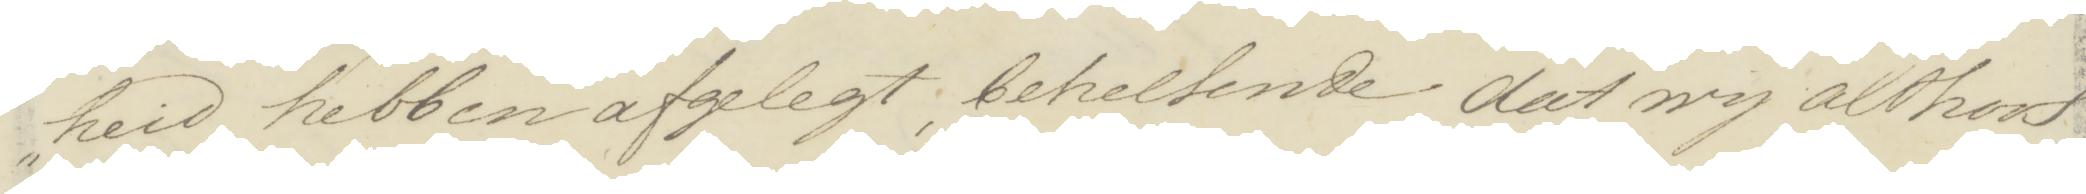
„heid hebben afgelegt, behelsende dat wij althoos
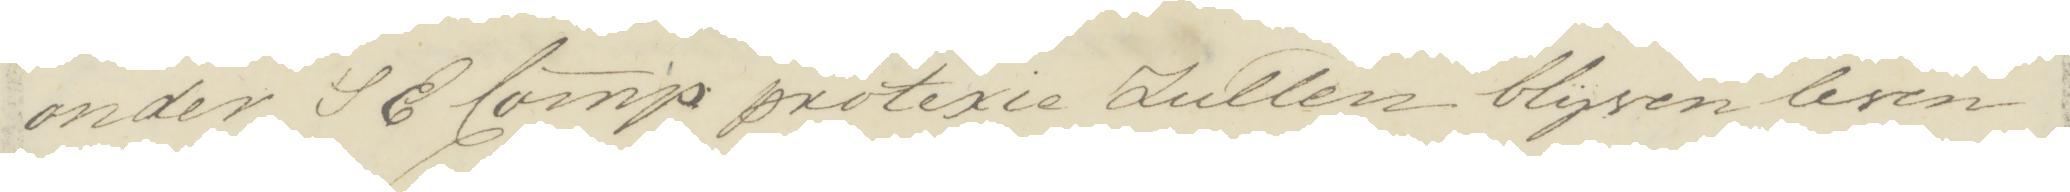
onder ’s E Comp protexie zullen blijven leven
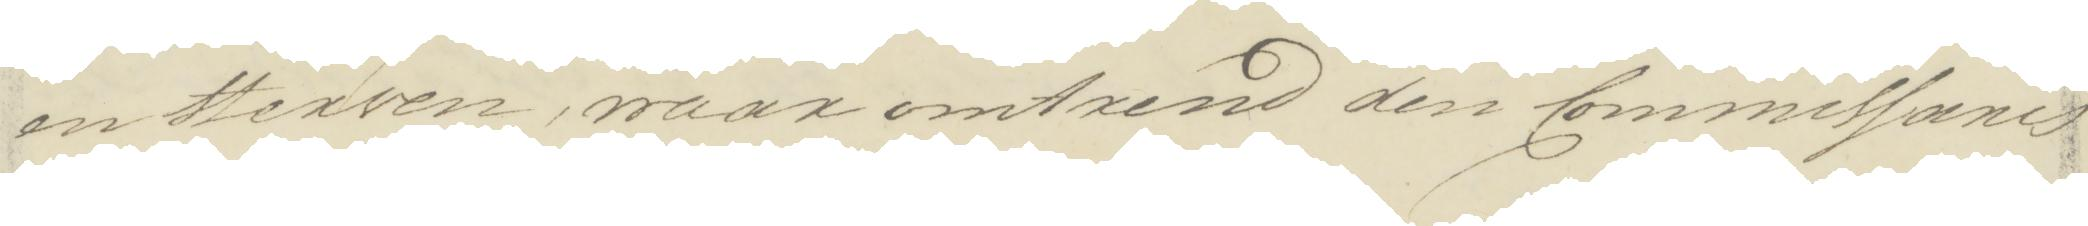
en sterven, waar omtrend den Commissaris
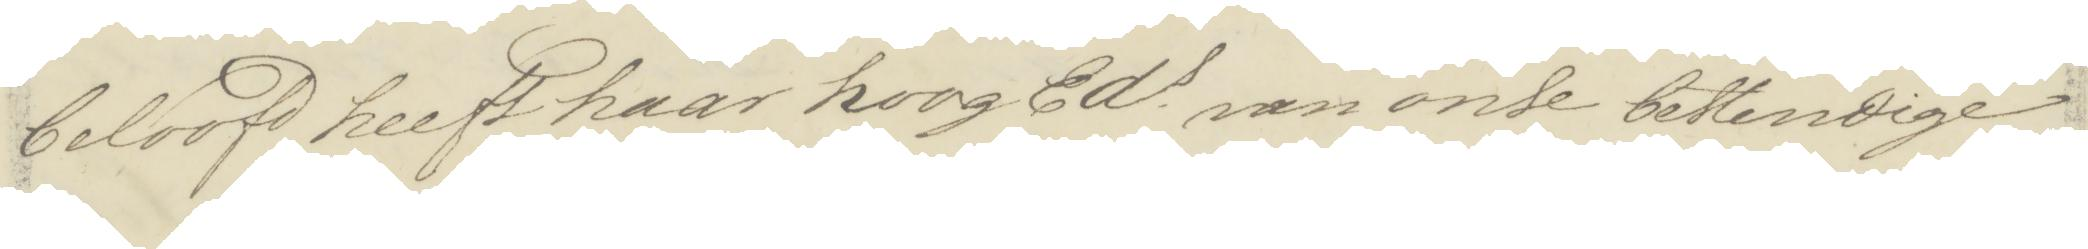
beloofd heeft haar hoog Ed:s van onse bestendige
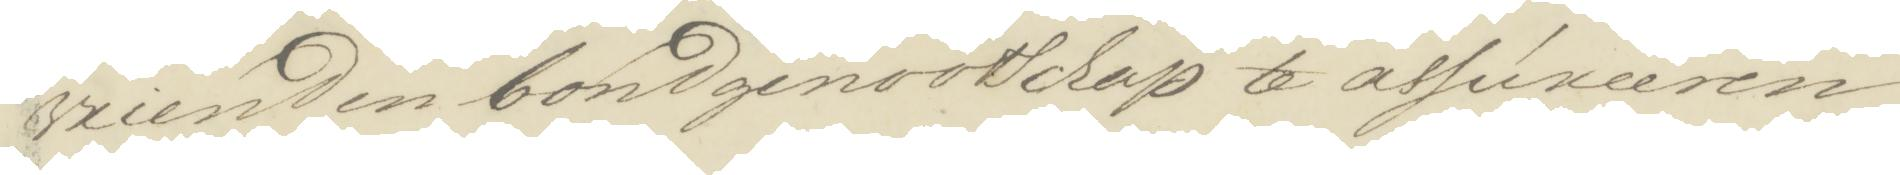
vriend en bond genootschap te assureeren
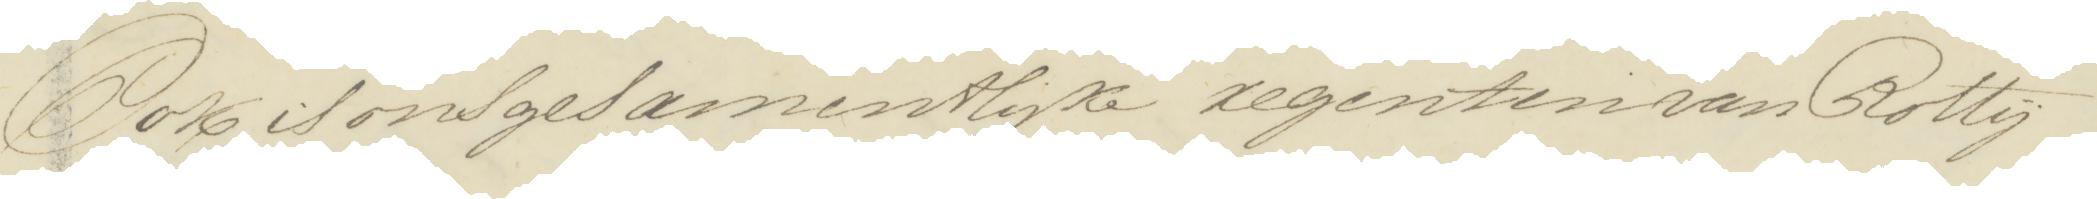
Ook is ons gesamentlijke regenten van Rottij
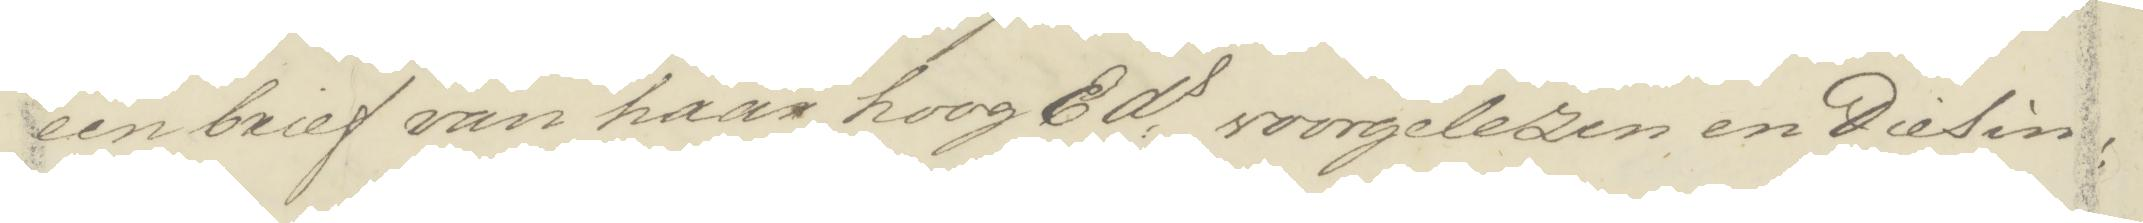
een brief van haar hoog Ed„s voorgelezen en dies in„
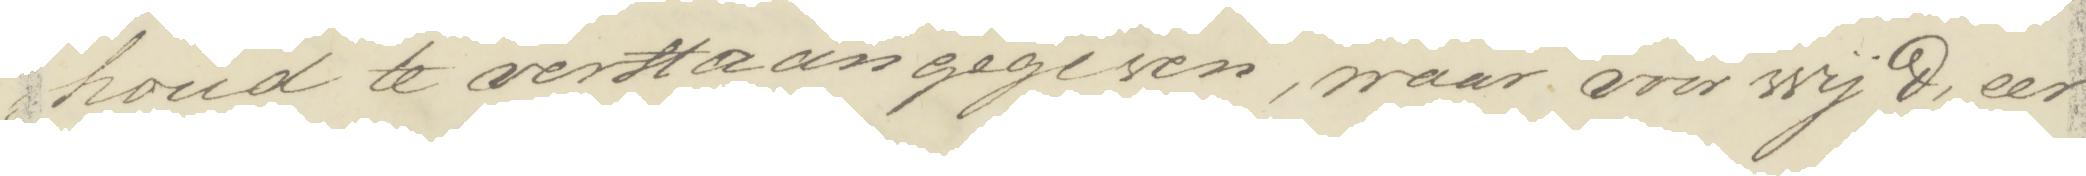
„houd te verstaan gegeven, waar voor wij d, eer
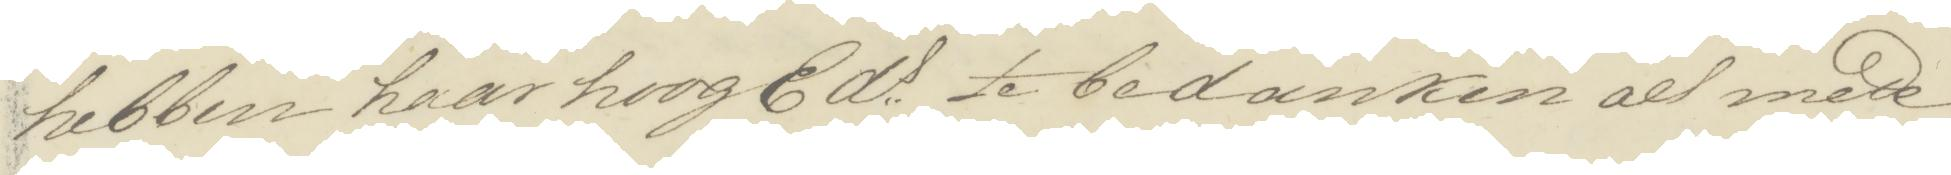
hebben haar hoog Ed„s te bedanken als mede
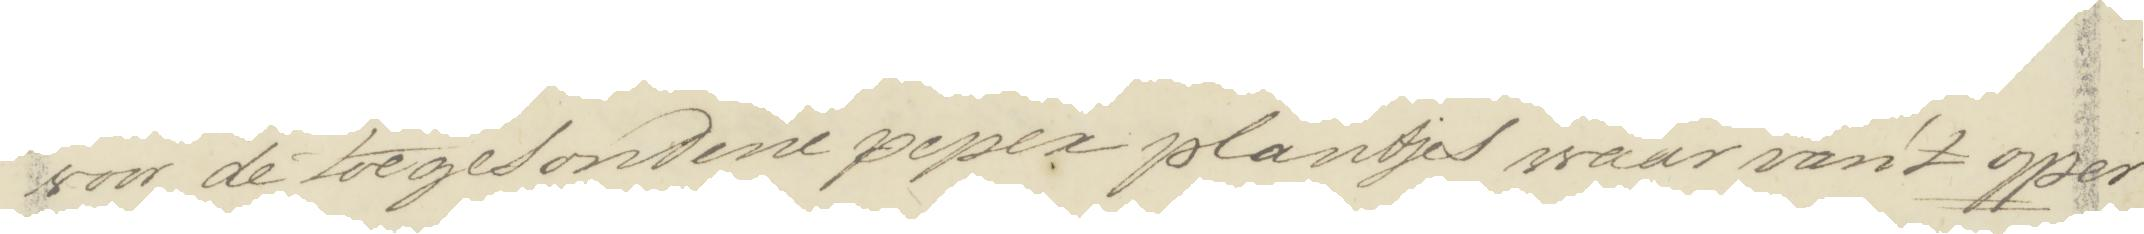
voor de toegesondene peper plantjes waar van ’t opper
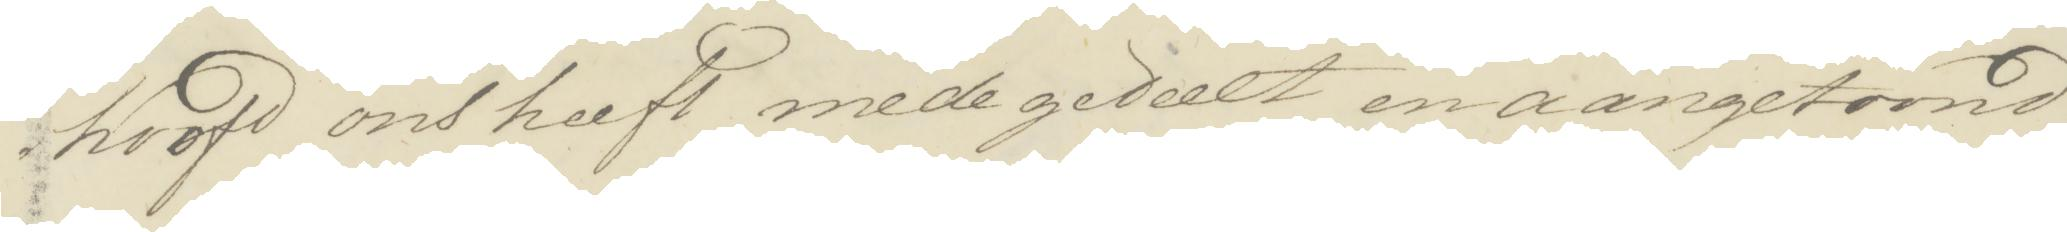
„hoofd ons heeft mede gedeelt en aangetoond
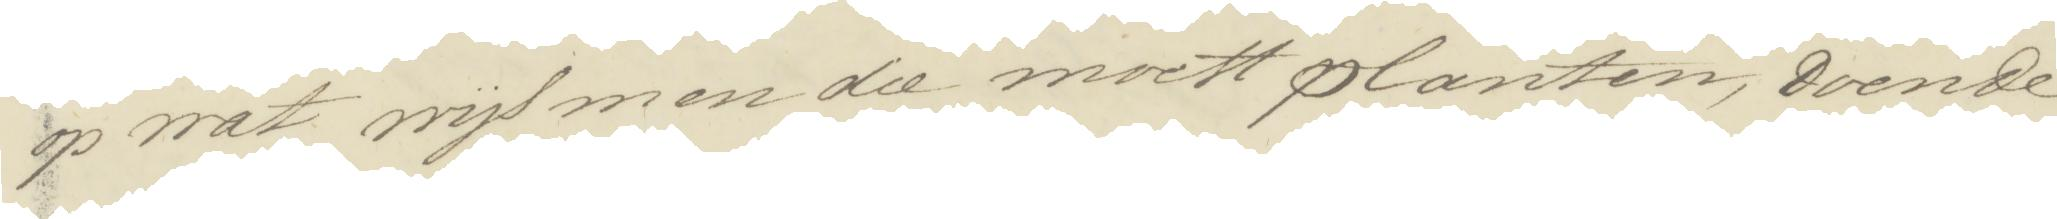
op wat wijs men die moett planten, doende
